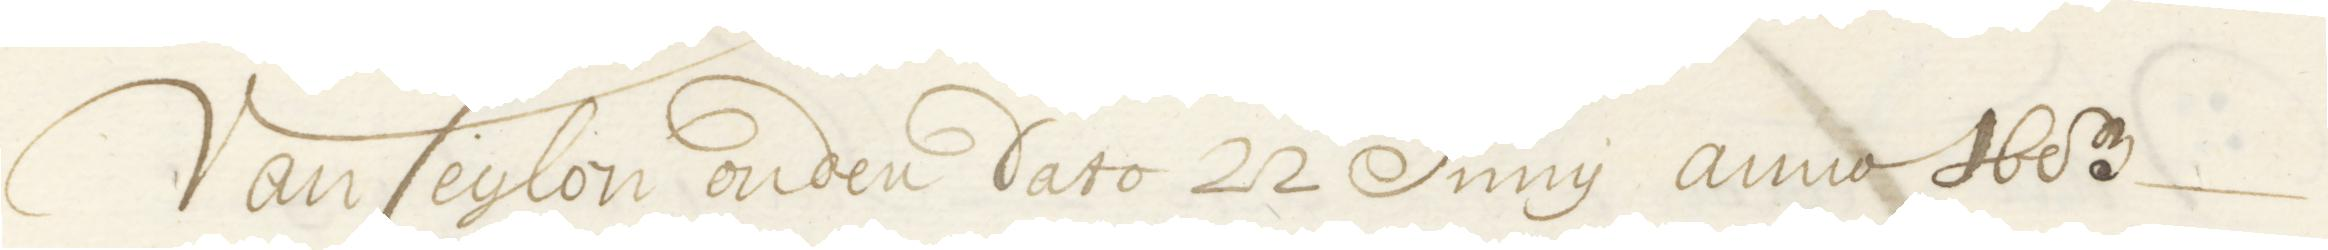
Van Ceijlon onder dato 22 Iunij anno 1683 —
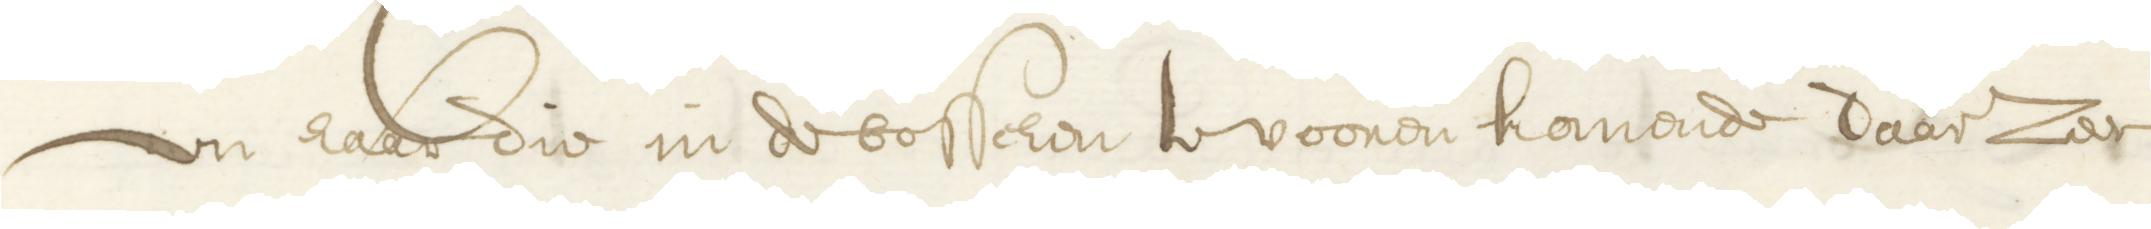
en haar die in debosschen tevooren komende daar zeer
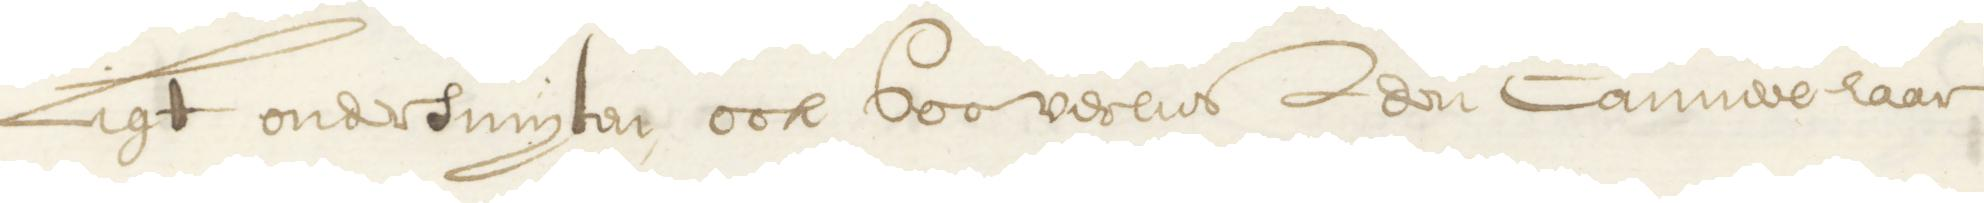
ligt ondersmijten ook soo verliest den canneel haar
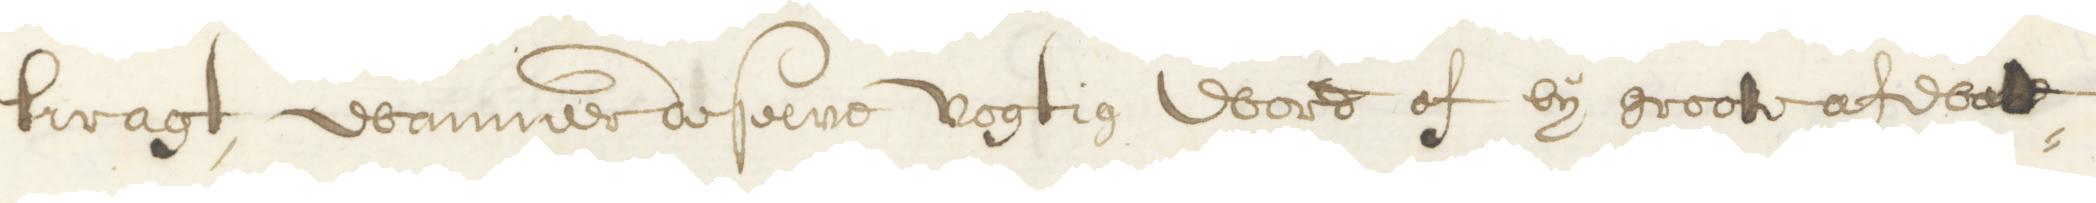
kragt, wanneer deselve vogtig word of bij groote afwat„
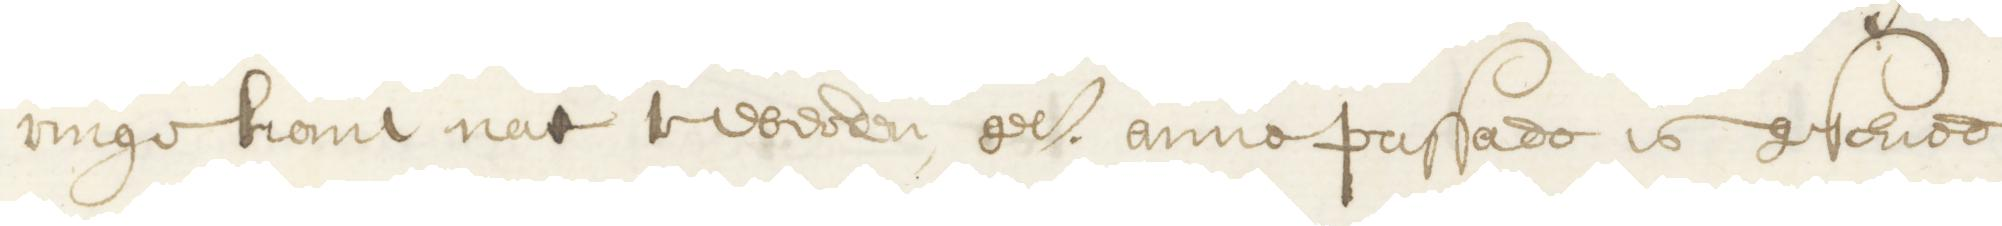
ringe komt nat tewerden gelijk anno passado is geschied
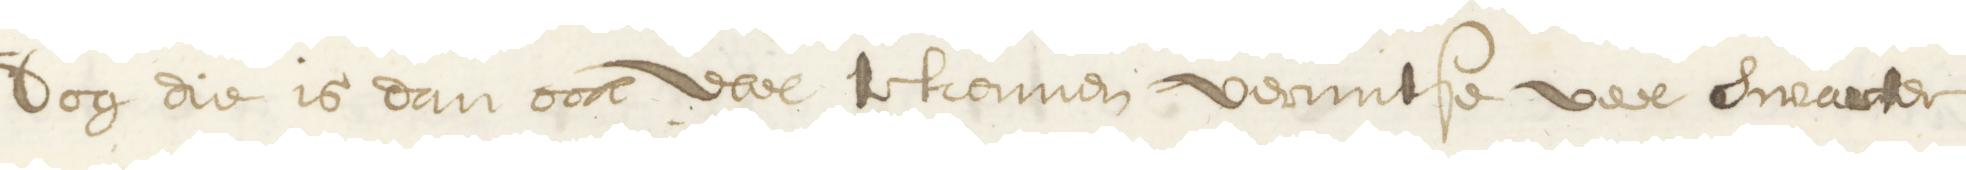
dog die is dan ook wel tekennen vermitse veel swarter
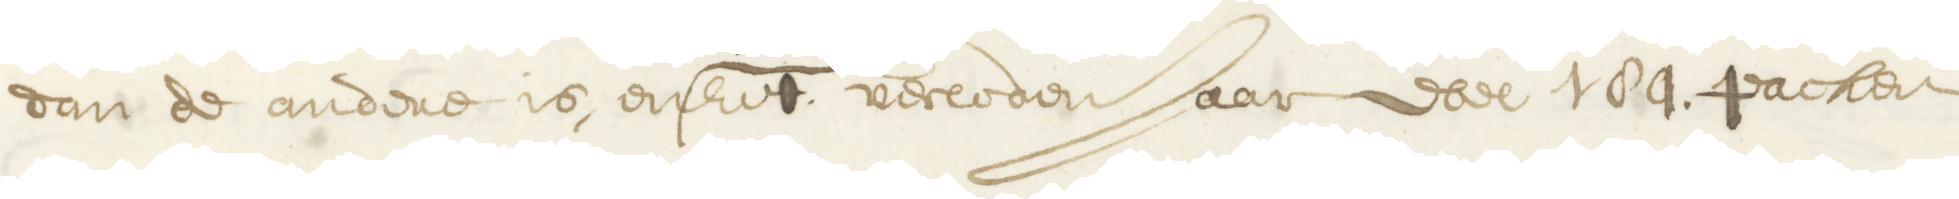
dan de andere is, en het verleden Jaar wel 184. packen
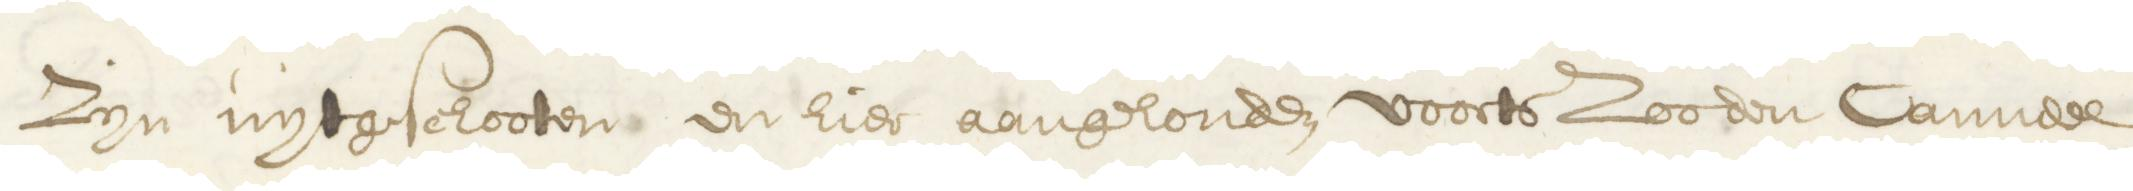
zijn uijtgeschooten en hier aangehouden voorts zoo den Canneel
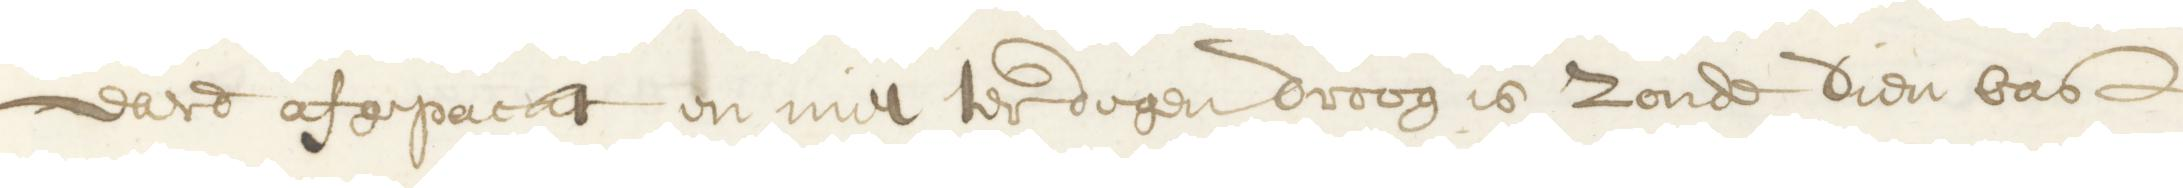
werd afgepackt en niet terdegen droog is zoude dien bast
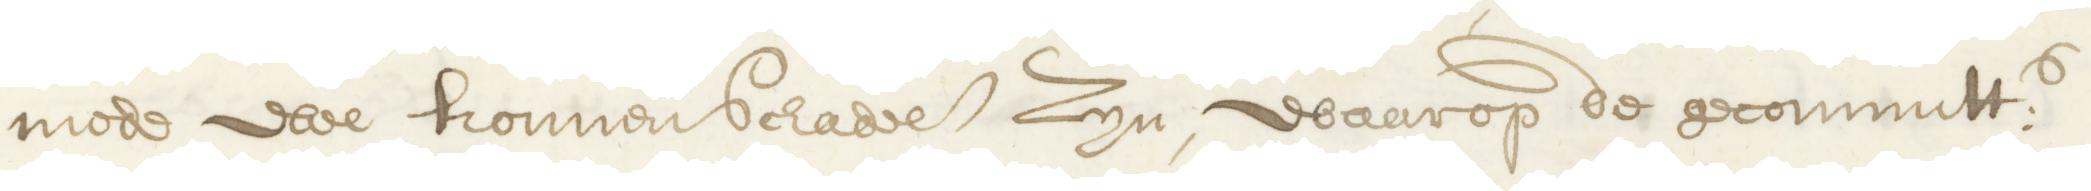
mede wel konnen schadelijk zijn, waarop de gecommitt:s
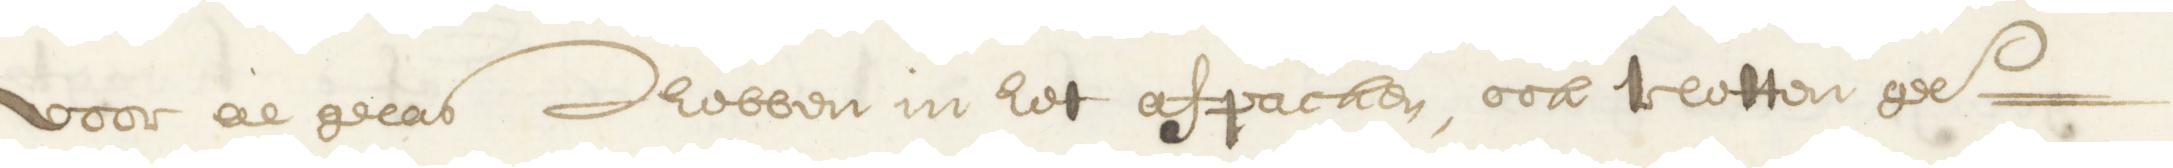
voor al gelast hebben in het afpacken, ook te letten gelijk
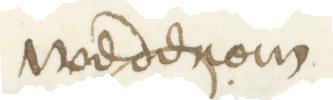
wederom
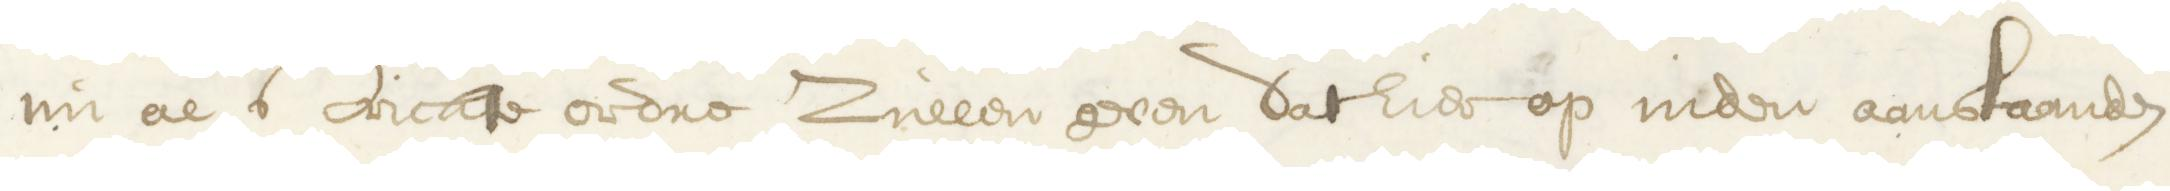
nu al „ strickte ordre zullen geven dathier op inden aanstaanden
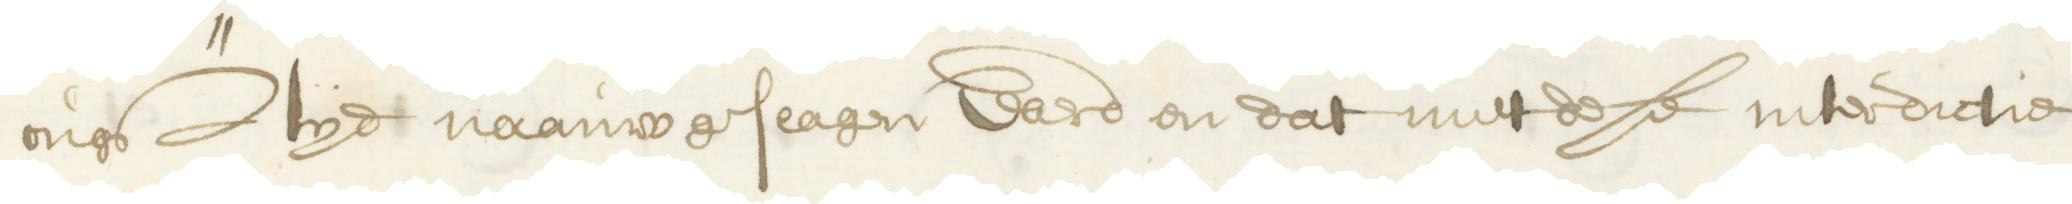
ougst tijd naauw geslagen werd en dat met dese interdictie
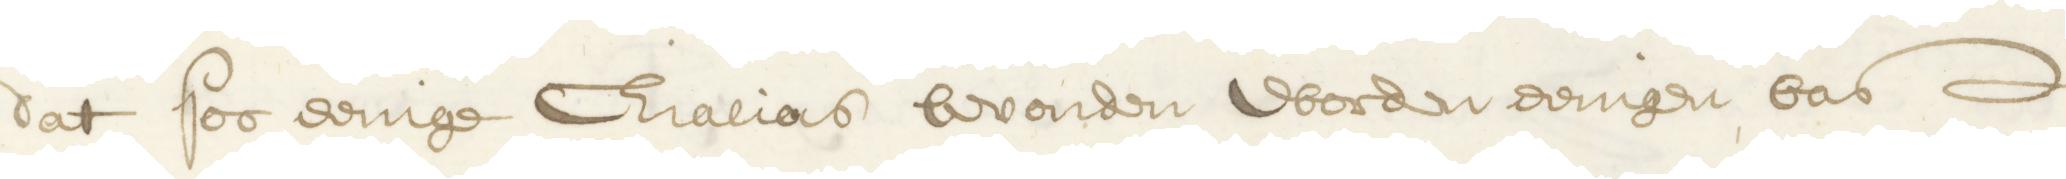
dat soo eenige Chialias bevonden worden eenigen bast
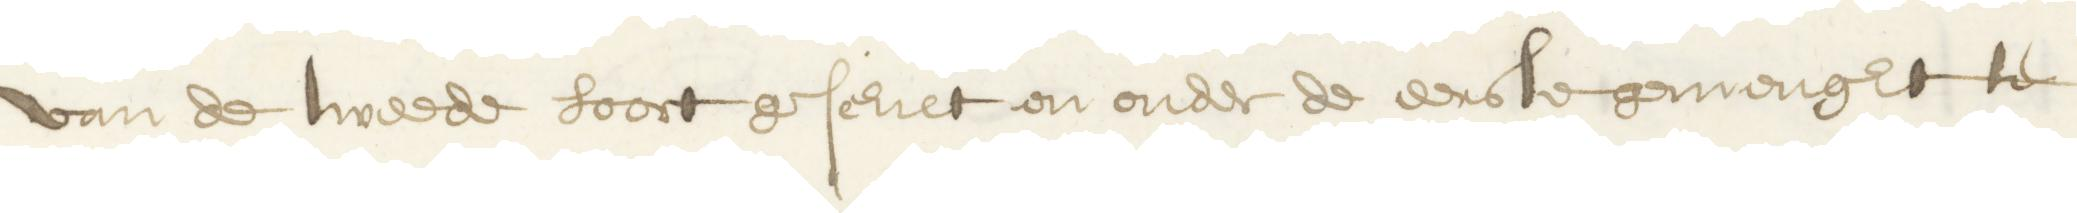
van de tweede soort geschilt en onder de eerste gemenght te
